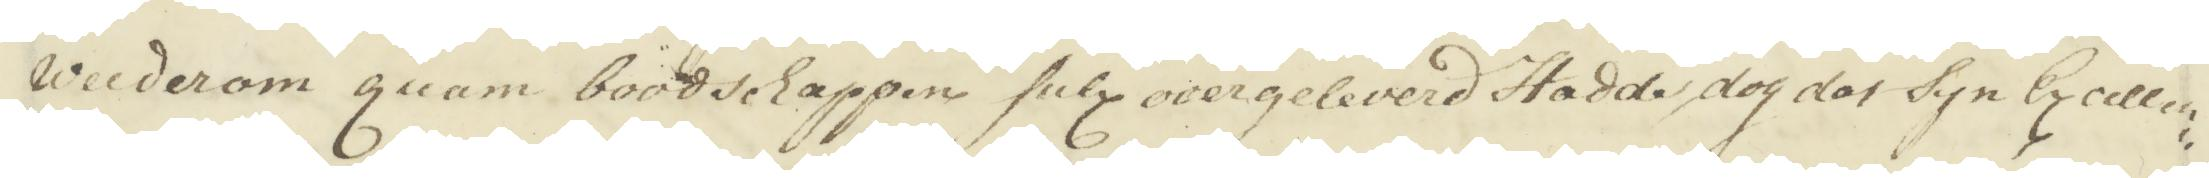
weederom quam boodschappen sulx overgeleverd Hadde, dog dat sijn Excellen„
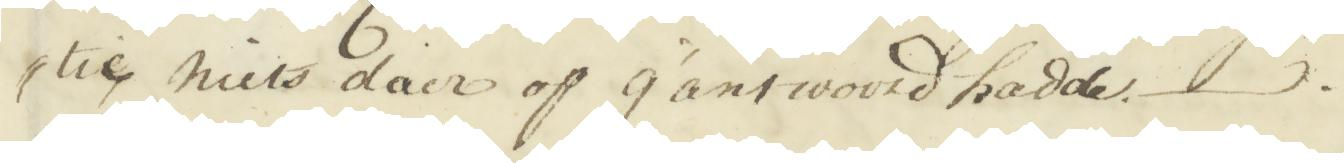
„tie niets daer op g’antwoord hadde.
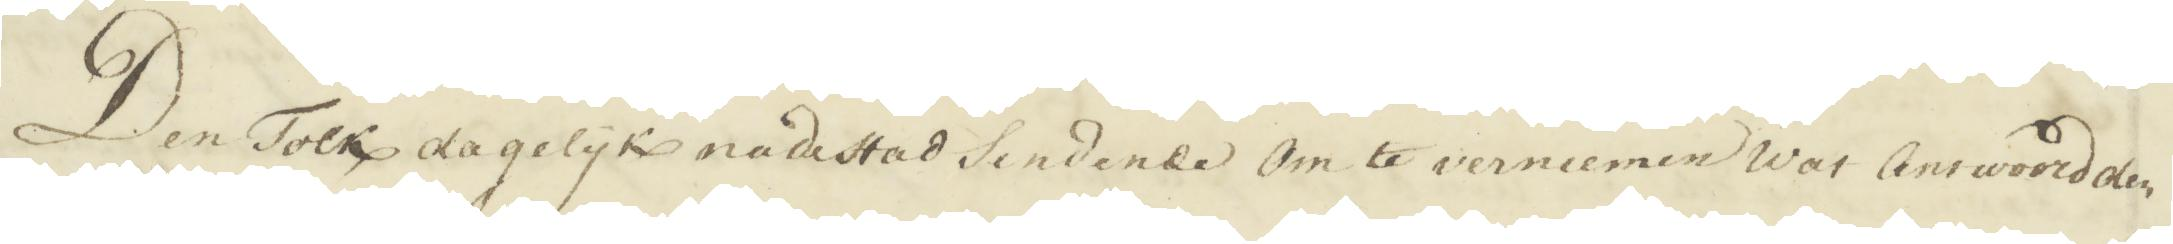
Den Tolk dagelijk na de stad sendende om te verneemen wat antwoorden
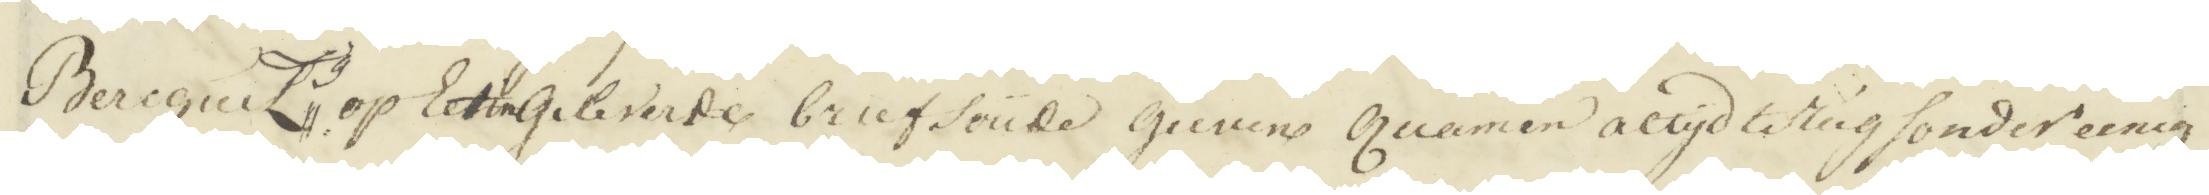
BercqueL„g op het ingeleverde brief soude geeven quamen altijd terug sonder eenig
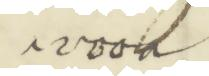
^voor
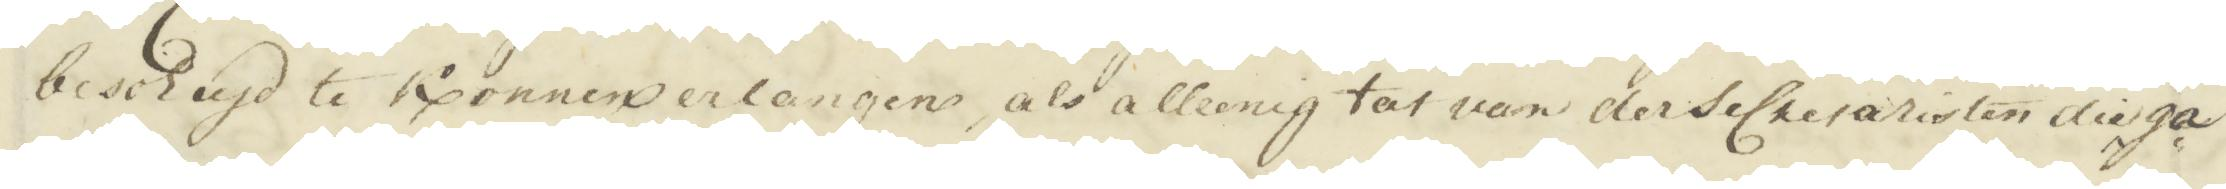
bescheijd te konnen erlangen, als alleenig tot van der secretaris ten die^ ga„
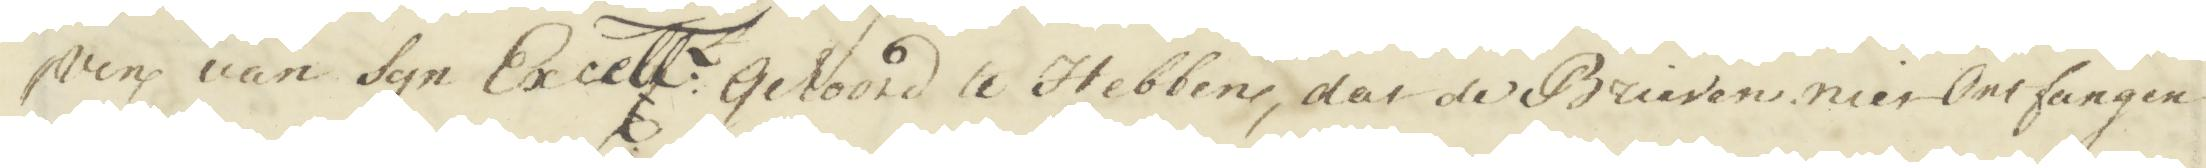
„ven van sijn Excell:t gehoord te Hebben, dat de Brieven niet ontfangen
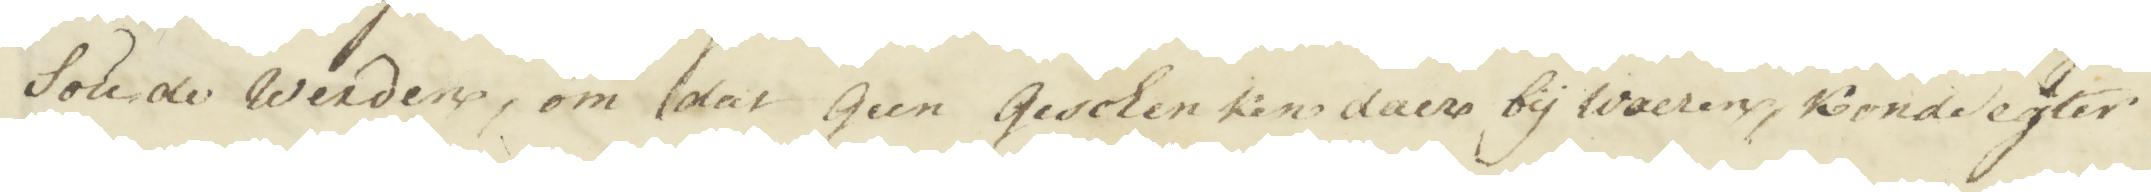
sou de werden, om dat geen geschenken daer bij waeren, konde egter
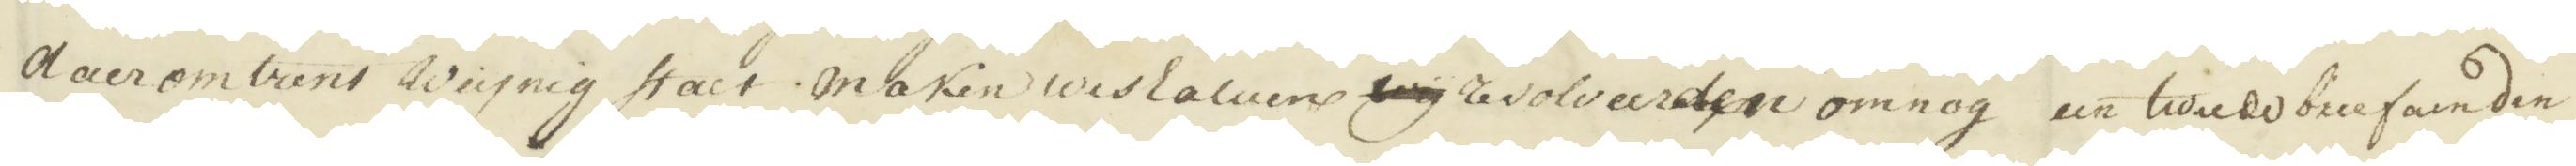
daer omtrent weijnig staet maken weshalven revolveerden om nog een tweede brief aen den
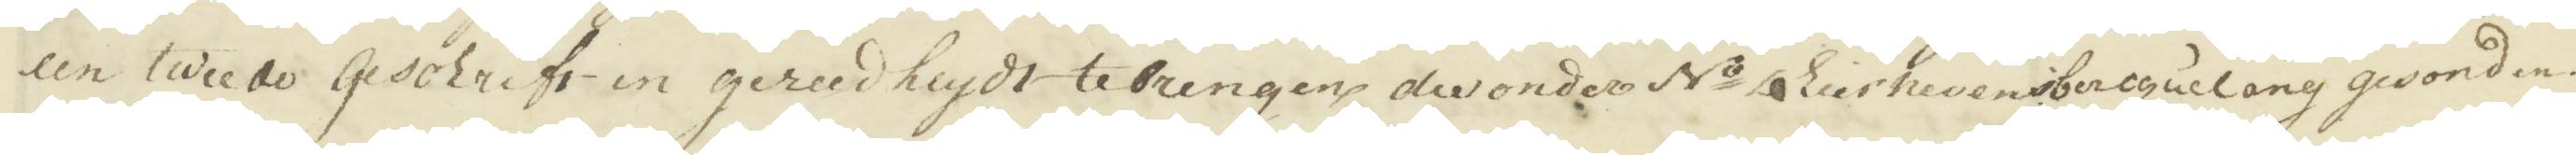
een tweede geschrift in gereedheijdt te brengen die onder N=o hiernevens bercquelang gesonden.
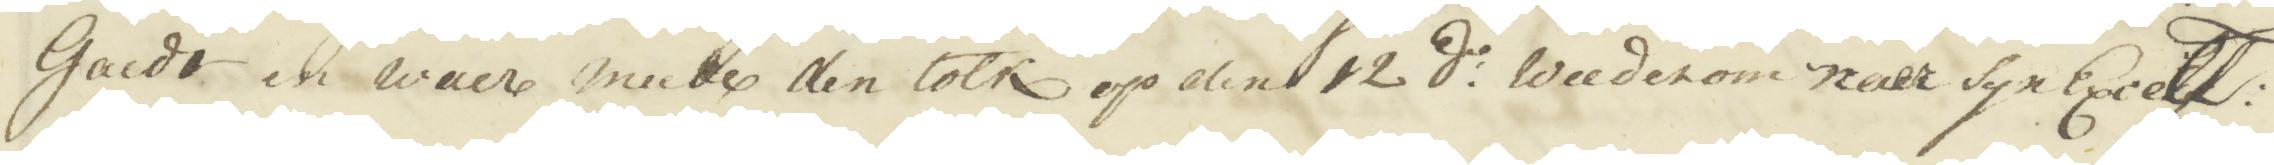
gaedt en waer meede den tolk op den 12: d:o weederom naer sijn Excell:
